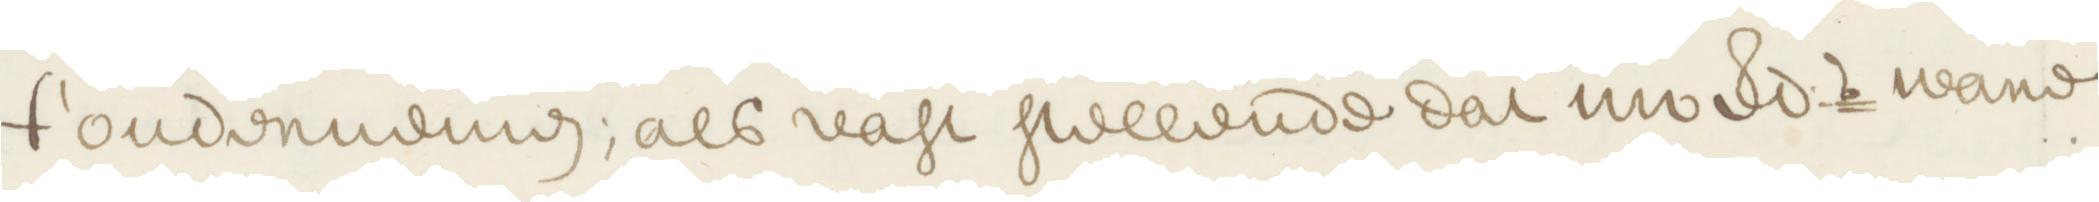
t'ondernemen; als vast stellende dat uw Ed:e ware
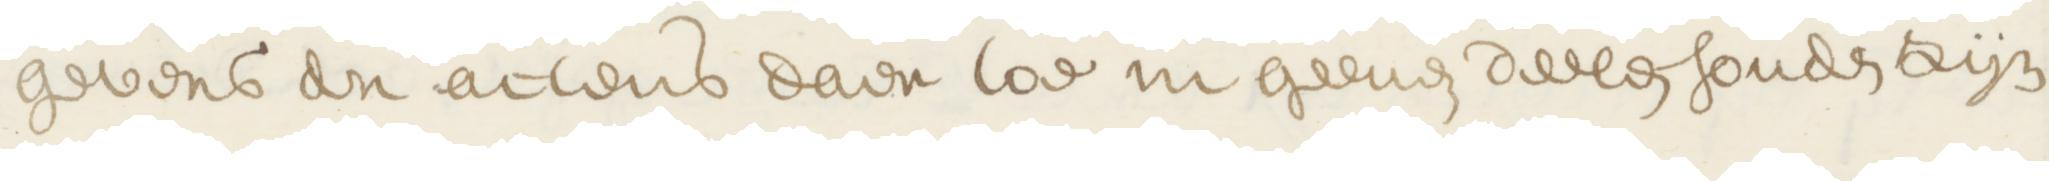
gevers der actens daer toe in geenen deelen souden zijn
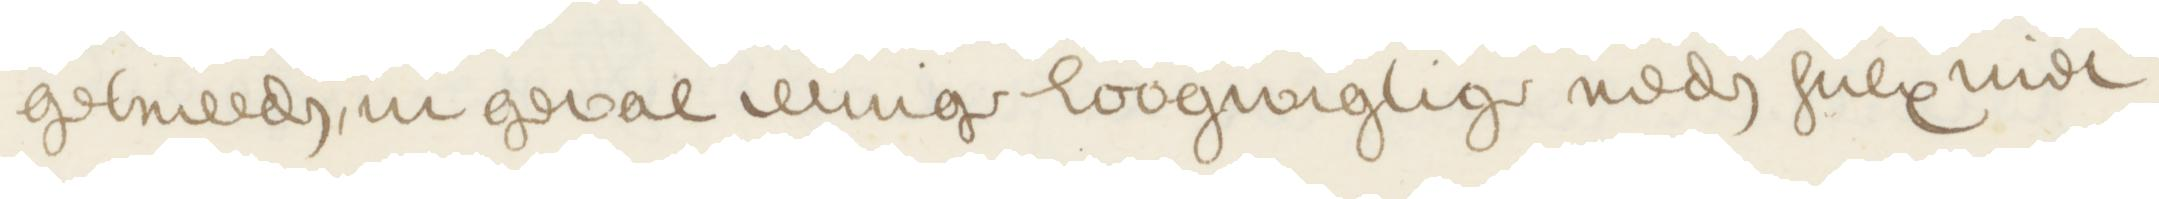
getreeden, in geval eenige hoogwigtige reden sulx niet
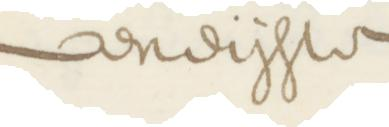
vereijste
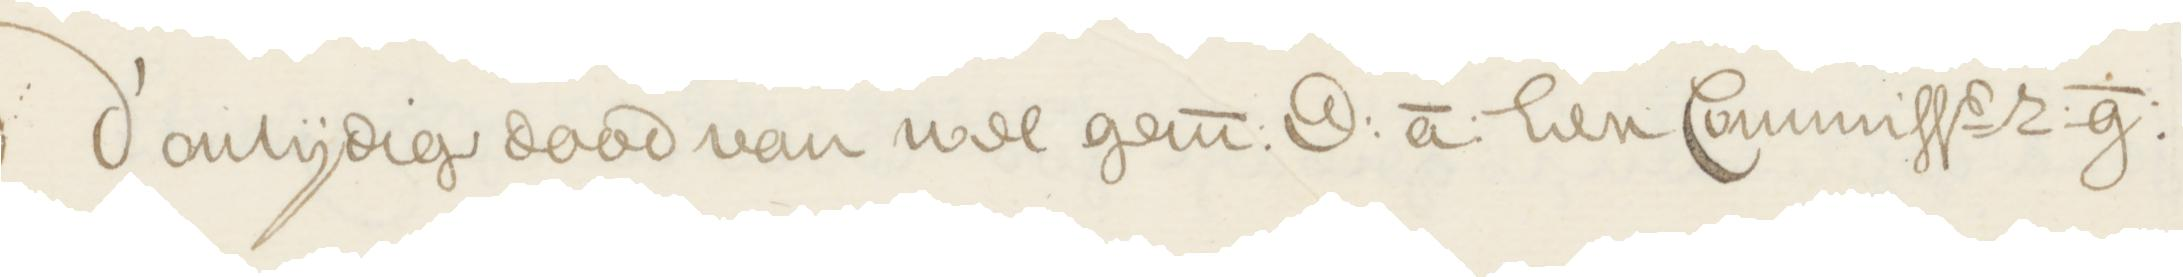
d’ontijdige dood van wel gem: E: a: heer Commiss=s z: g:
